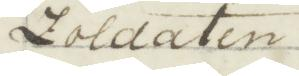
Zoldaten
